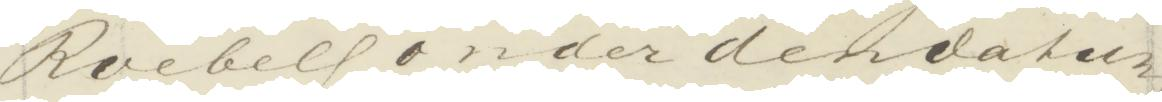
Roebels onder den datum
